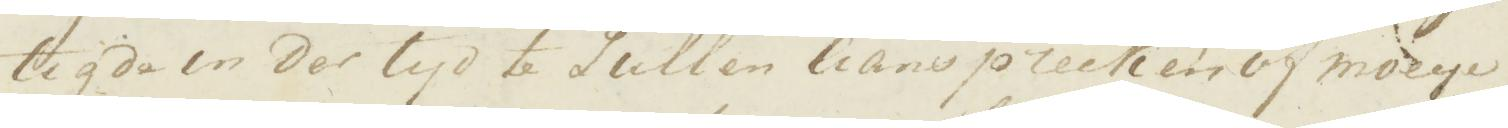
tigde in der tyd te zullen aanspreeken of moeye
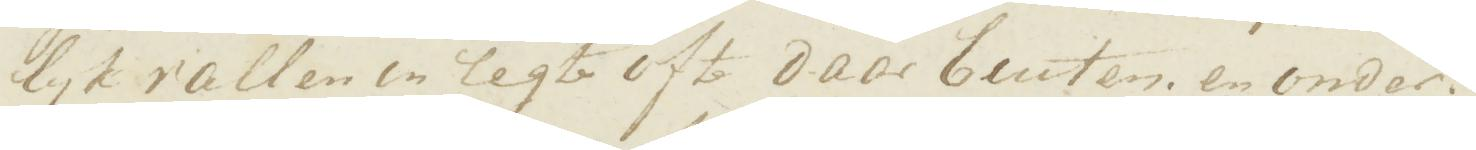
lyk vallen in regt oft daar buiten, en onder,
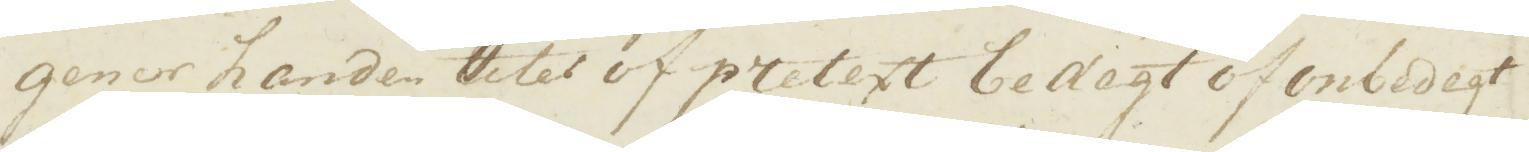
gener handen titel of pretext bedagt of onbedagt
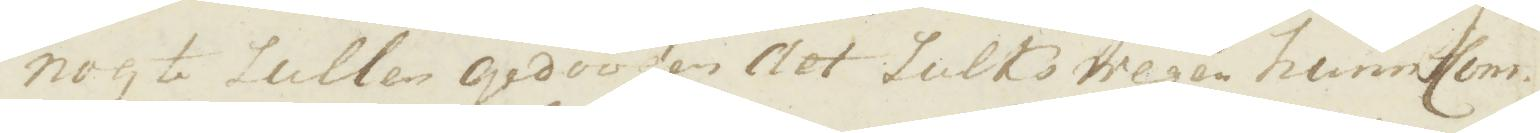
nog te zullen gedoogen dat zulks wegen hunn Com,
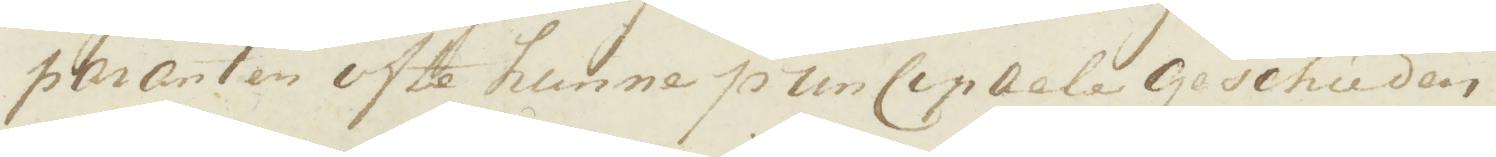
paranten ofte hunne principaale geschieden
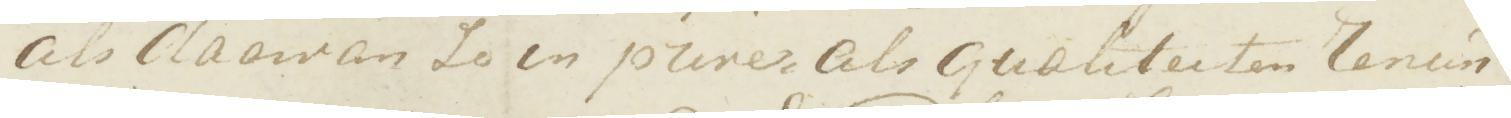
als daarvan zo in privé, als qualiteiten renun
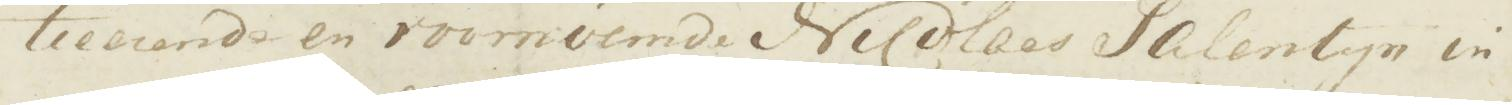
tieerende en voornoemde Nicolaas Salentijn in
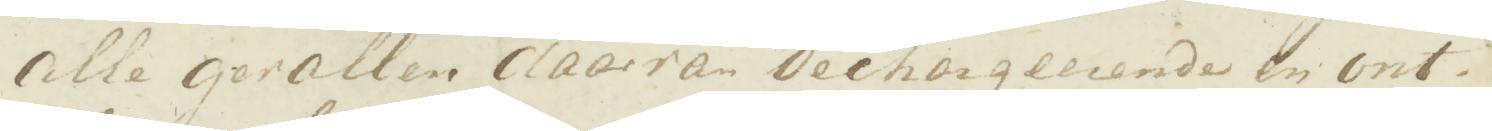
alle gevallen daarvan dechargeerende en ont_
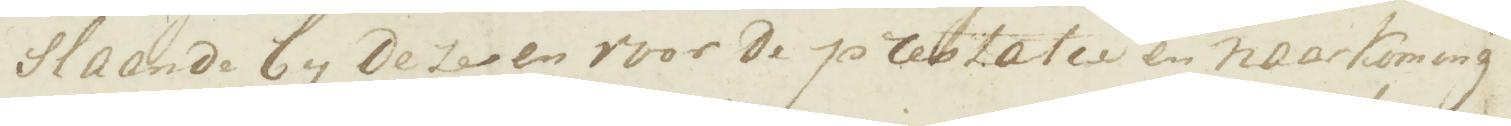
slaande by deze en voor de prestatie en naarkoming
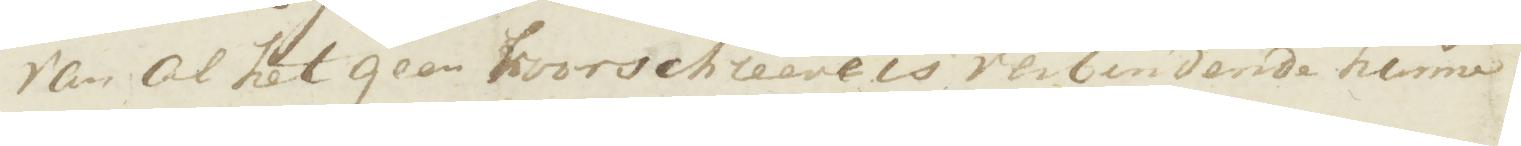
van al het geen voorschreeve is verbindende hunne
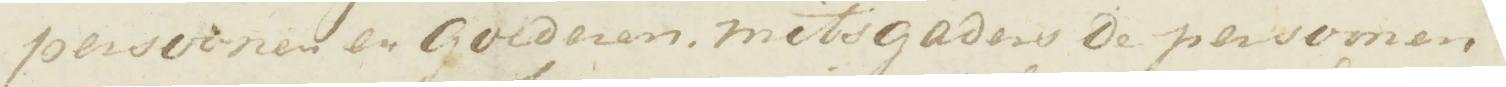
persoonen en goederen, mitsgaders de personen
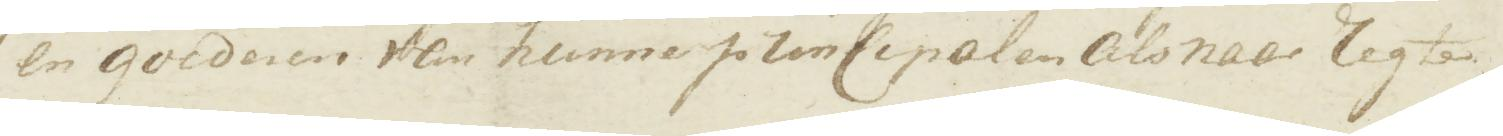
en goederen van hunne principalen als naar Regte
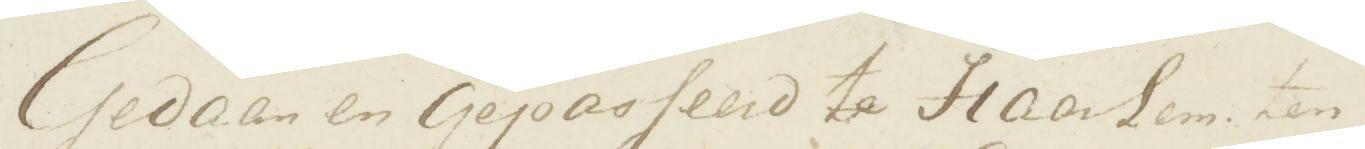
Gedaan en gepasseerd te Haalem, ten
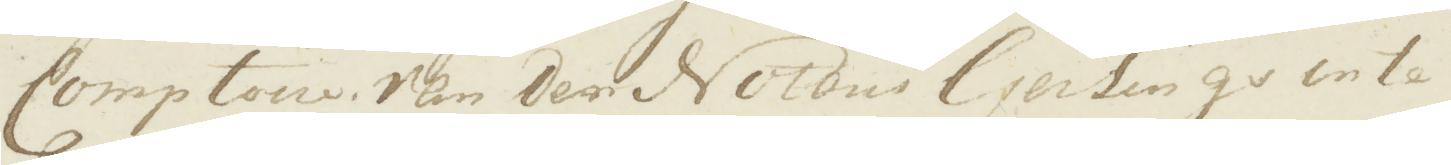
Comptoire van den Notaris Gerlings in te
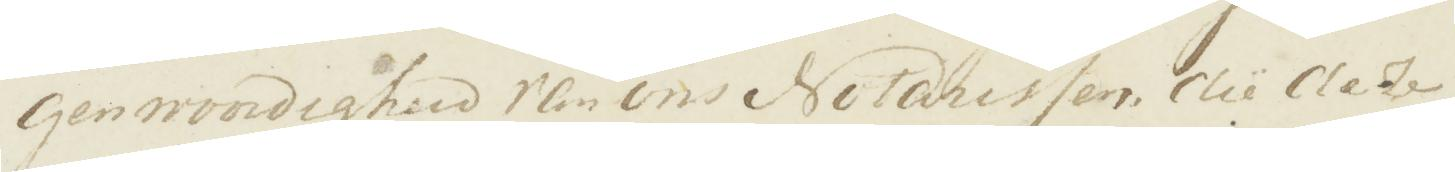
genwoordigheid van ons Notarissen, die deze
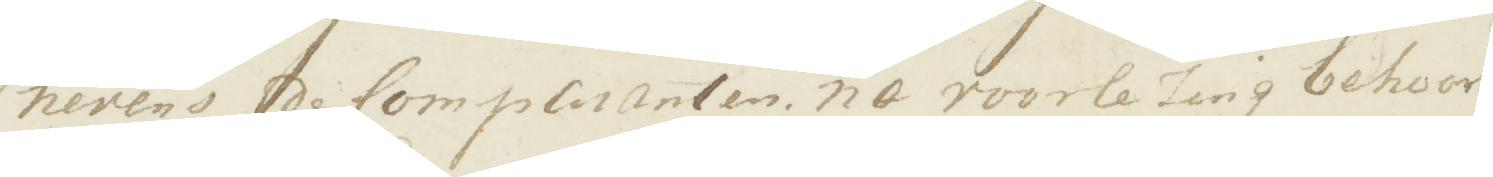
nevens de Comparanten, na voorlezing behoor
